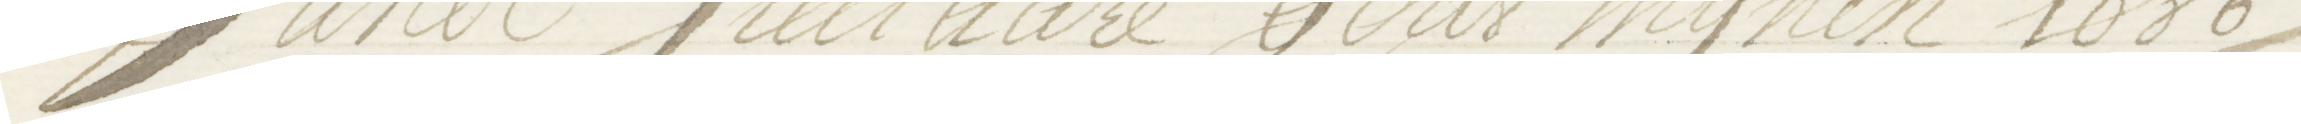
Vande Sillidare gout mijnen 1686
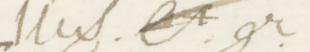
inver. l.t g.r
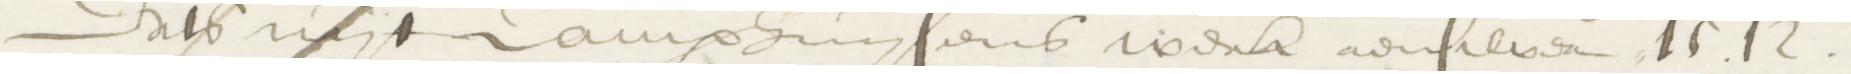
Erts uijt Camphuijsens werk aensilver „ 15. 12.
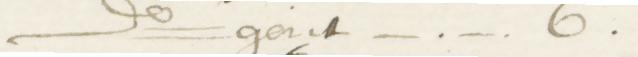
_=o gout —. —. 6.
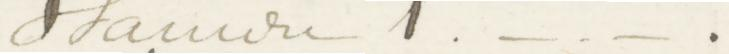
Ssamen 1. —. —.
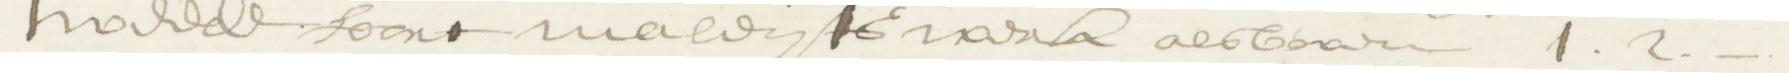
tweede soort maleijts werk als boven 1. 2. —.
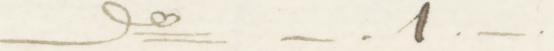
_=o —. 1. —.
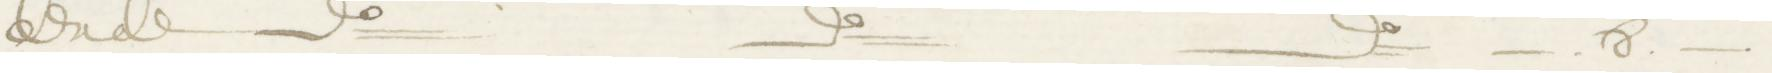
derde _=o _=o _=o —. 8. —.
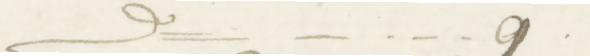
_=o —. —. 9.
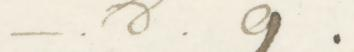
—. 8. 9.
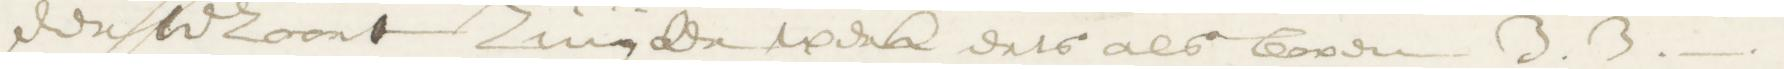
eerstezoort zuijder werk erts als boven 3. 3. —.
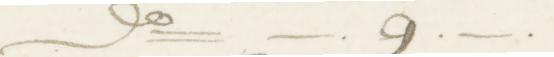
_=o —. 9. —.
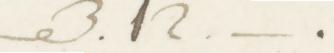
3. 12. —.
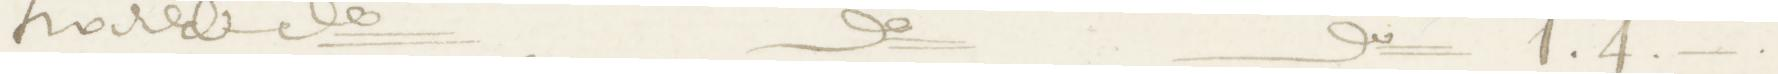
tweede _=o _=o _=o 1. 4. —.
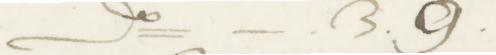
_=o —. 3. 9.
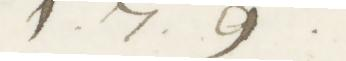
1. 7. 9.
